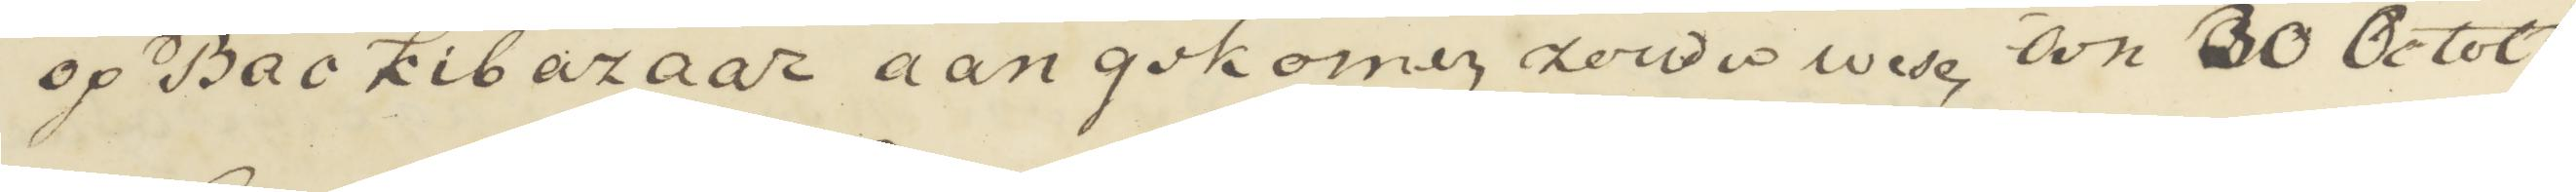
op Backibazaar aangekomen zoude wesen den 30 Octob:r
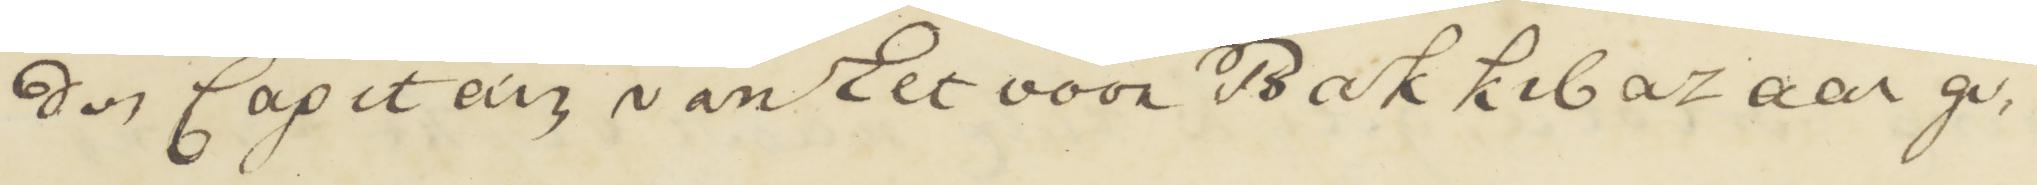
den Capitain van het voor Bakkibazaar ge„
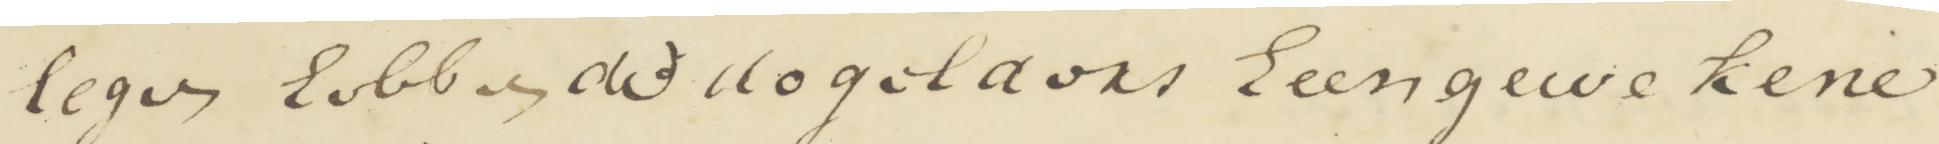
legen hebben de Hogelaers Eeen gewekene
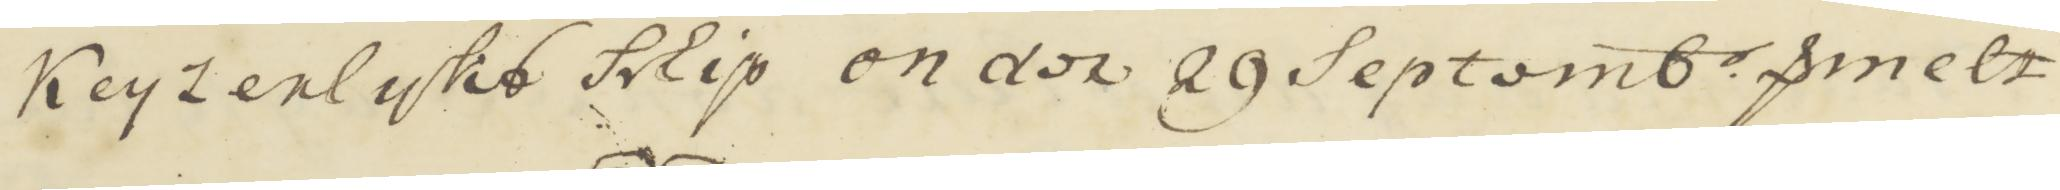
Keyzerlyks Schip onder 29 septemb:r vermelt
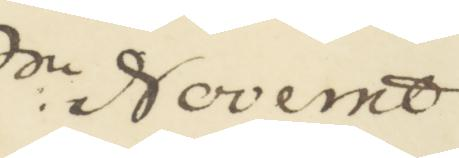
P:' Novemb
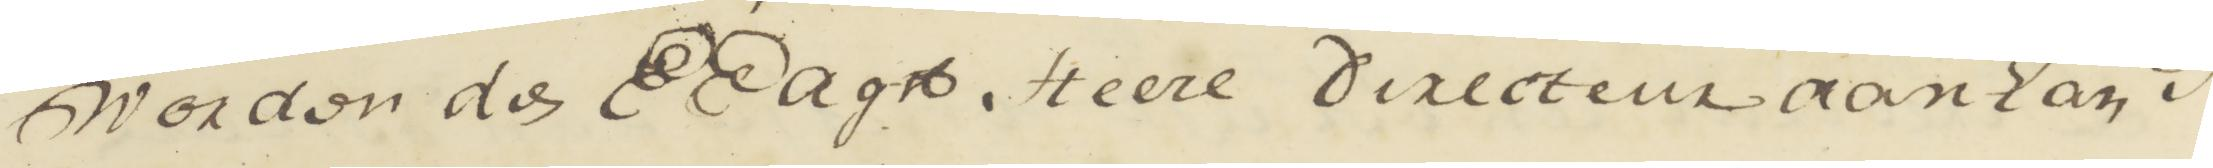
worden den EE agt. Heere directeur aan han
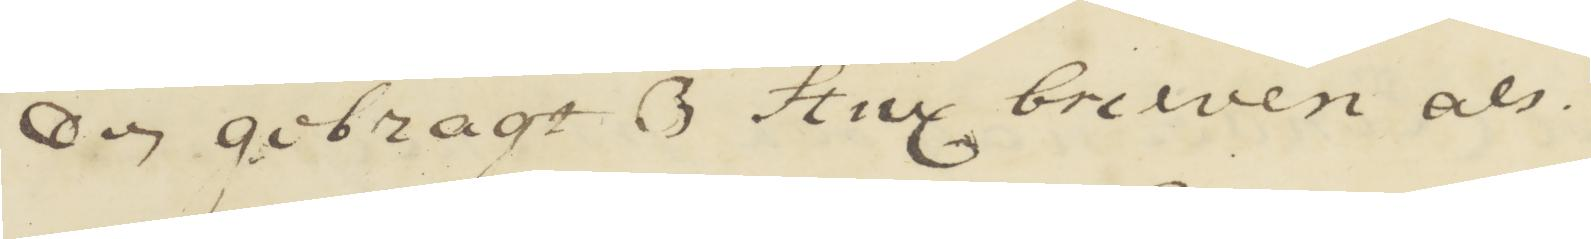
den gebragt 3 stux brieven als
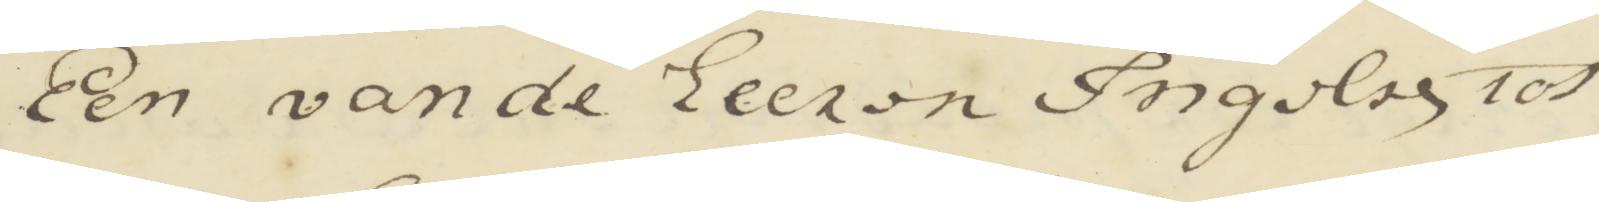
Een van de heeren Engelsen tot
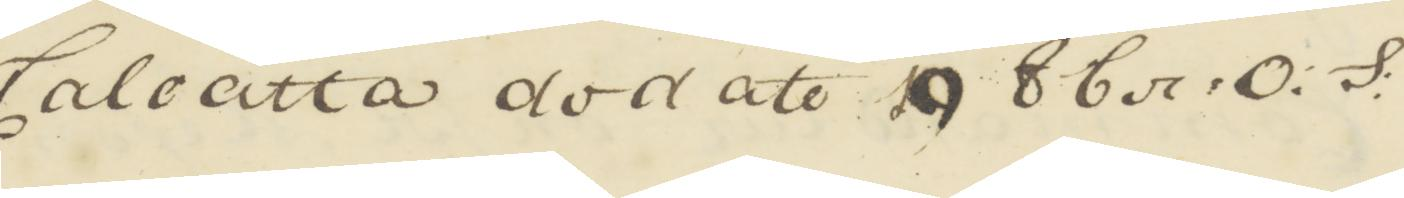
Calcatta de dato 19 8er .0: S.
